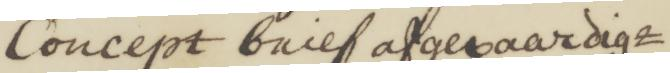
Concept brief afgevaardigt
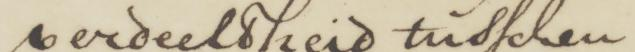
verdeeldheid tusschen
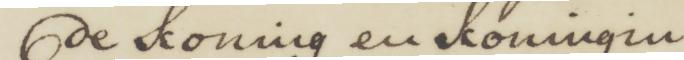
de koning en koningin
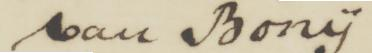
van Bonij
